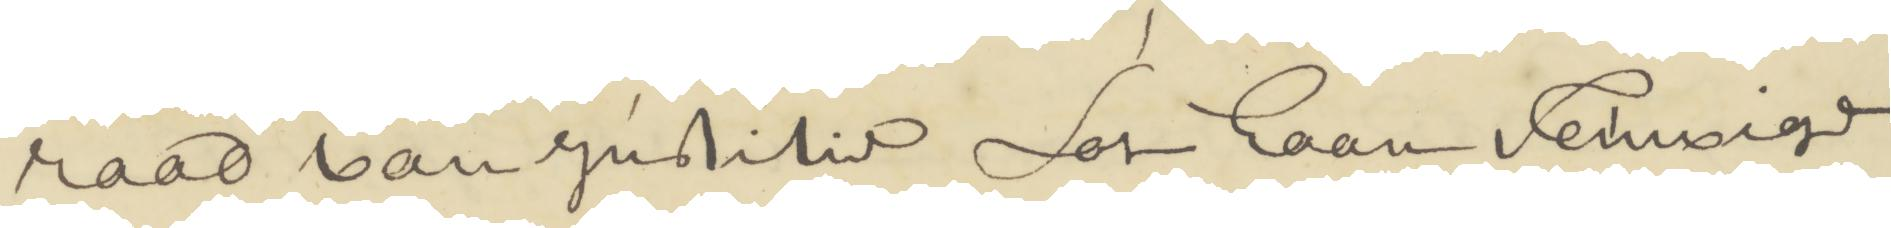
raad van justitie tot haar Eeuwige
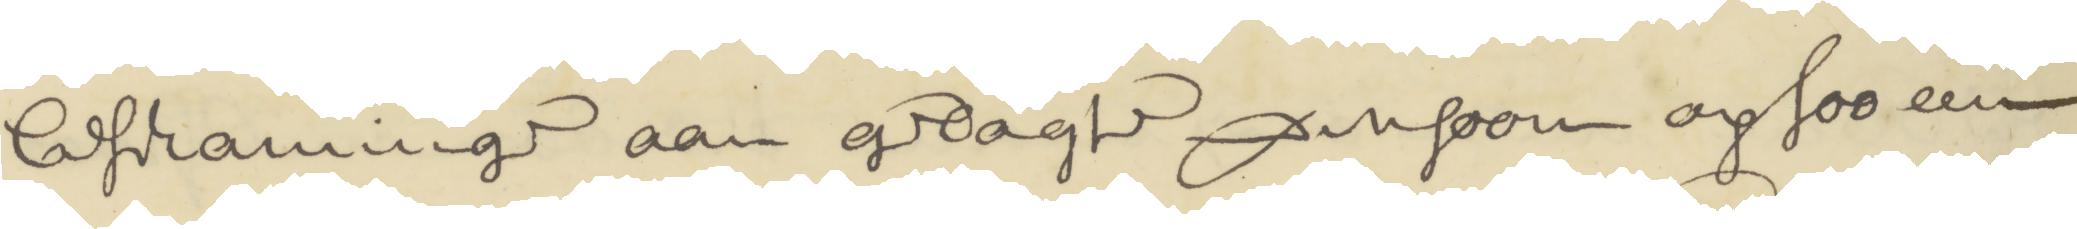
beschaminge aan gedagte persoon op soo een
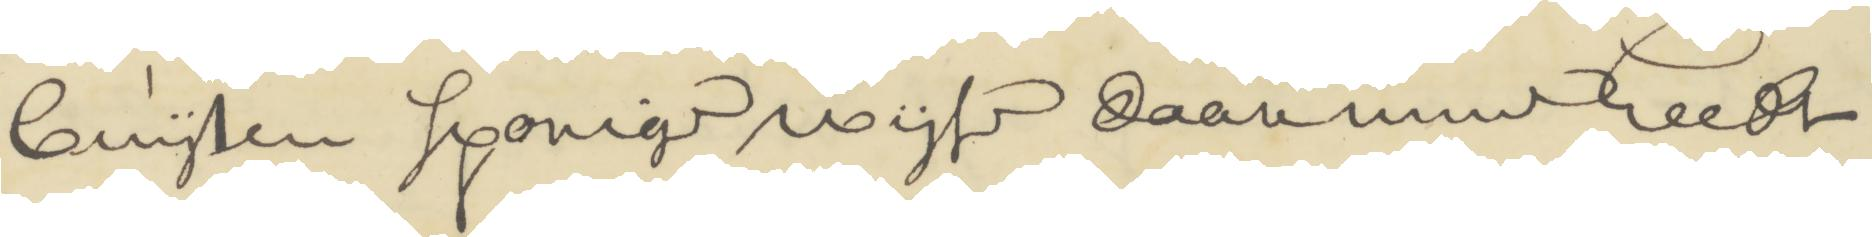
buijten sporige wijse daarinne heeft
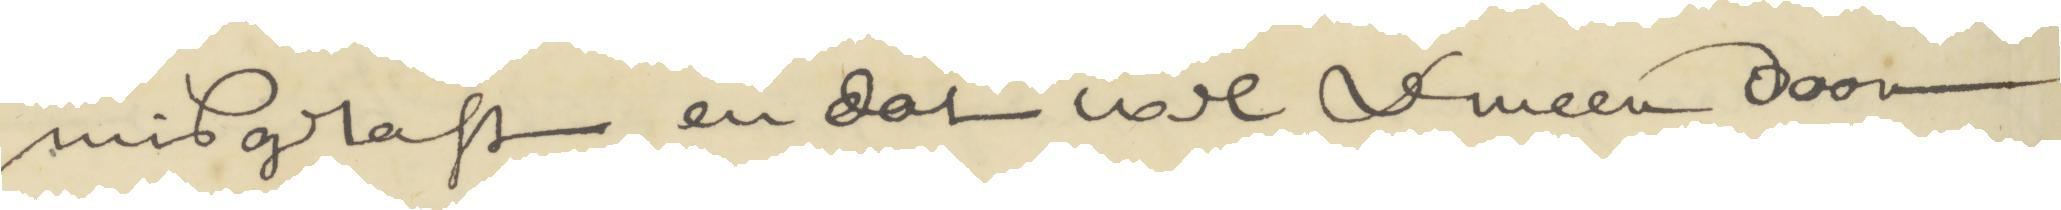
mis getast, en dat wel temeer door
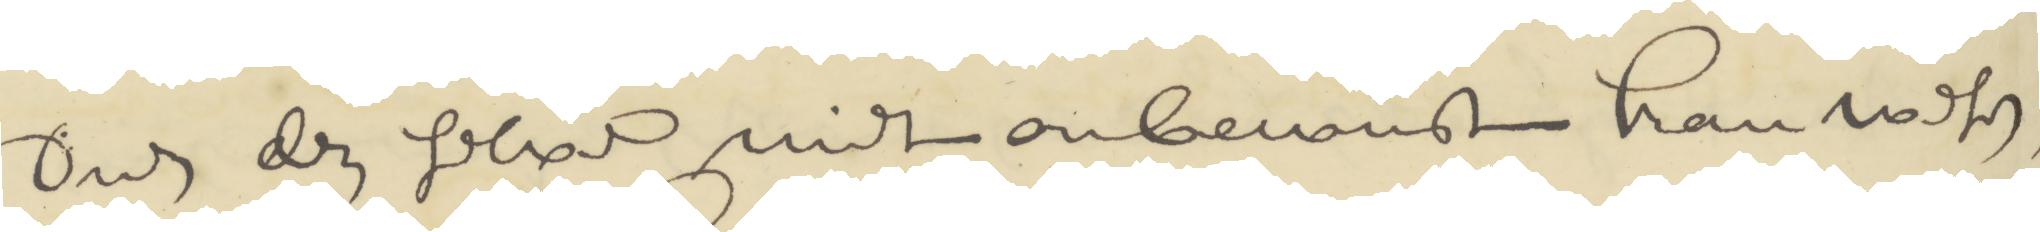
dien den selve niet onbewust kan wesen,
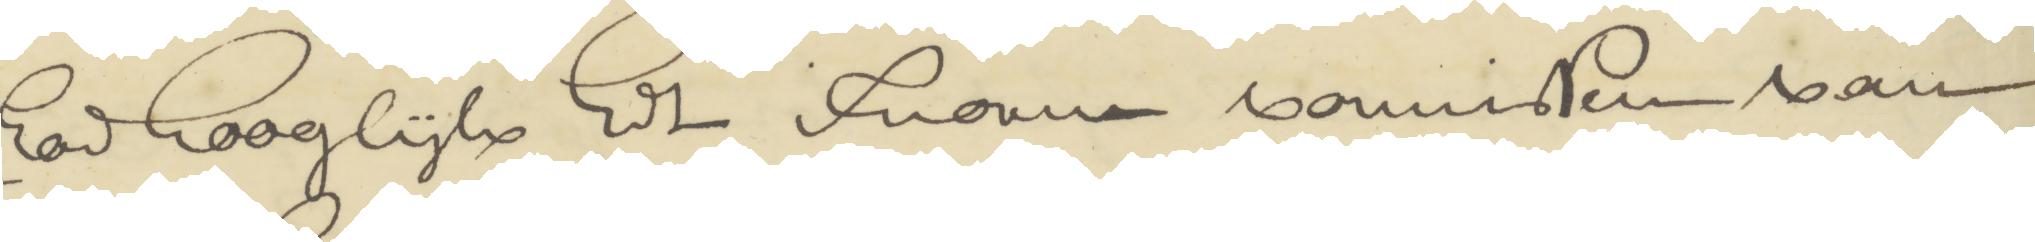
hoe hooglijk het Enorm vonnissen van
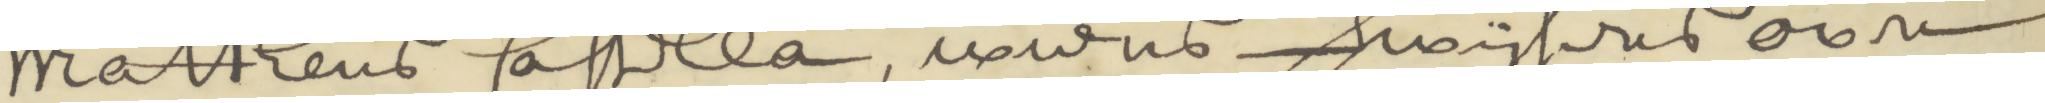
Mattheus Castella, wiens verwijsers over
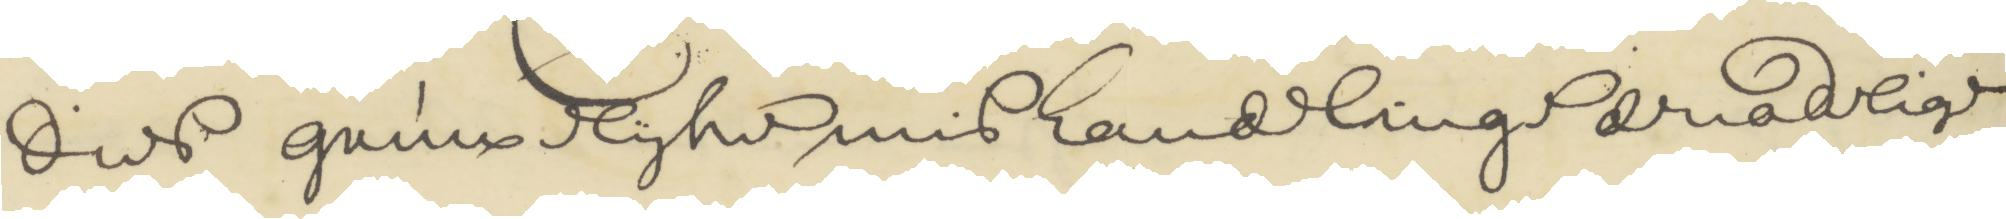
dies gruwelijke mishandelinge de nadelige
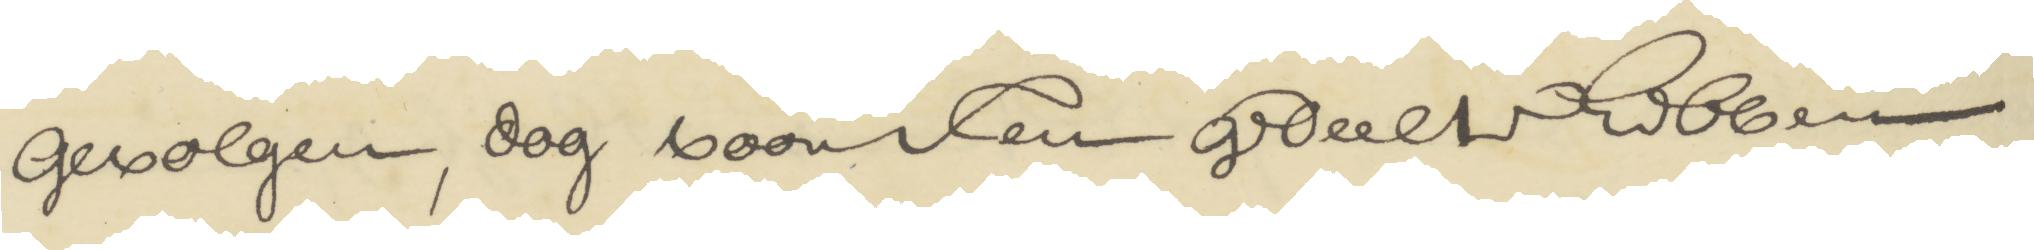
gevolgen, dog voor Een gedeelte hebben
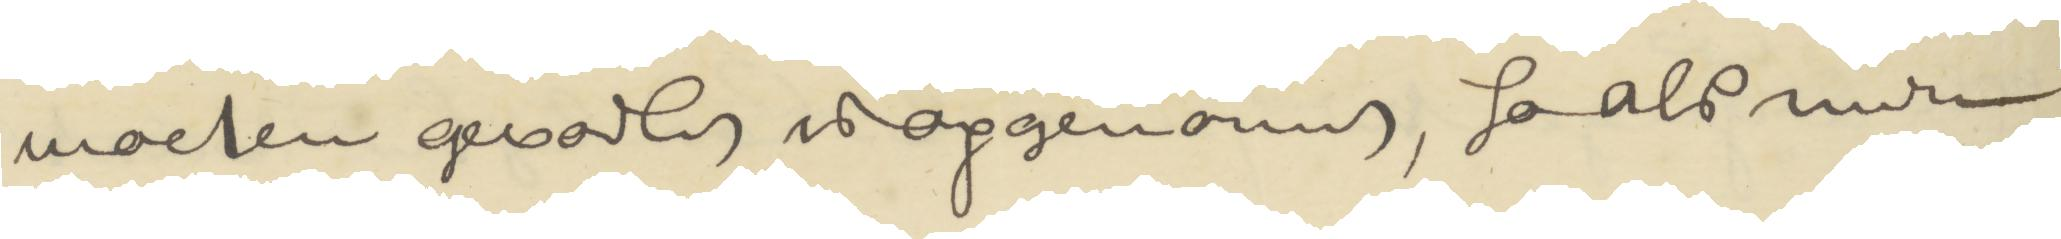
moeten gevoelen is op genomen, so als men
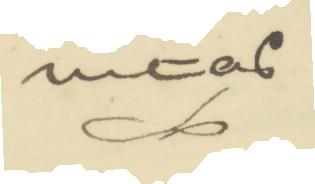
in cas
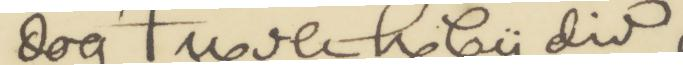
dog ’t welck bij die
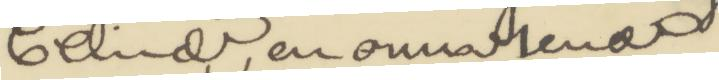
blinde en onwetende
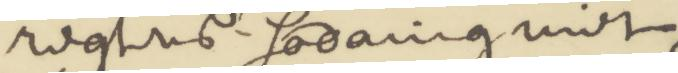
regters sodaing niet
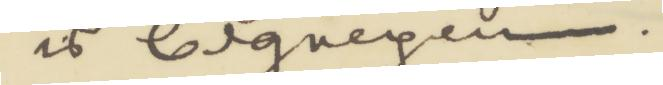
is begrepen.
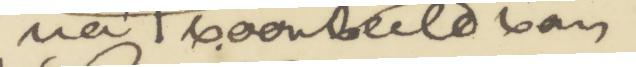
na 't voorbeeld van
